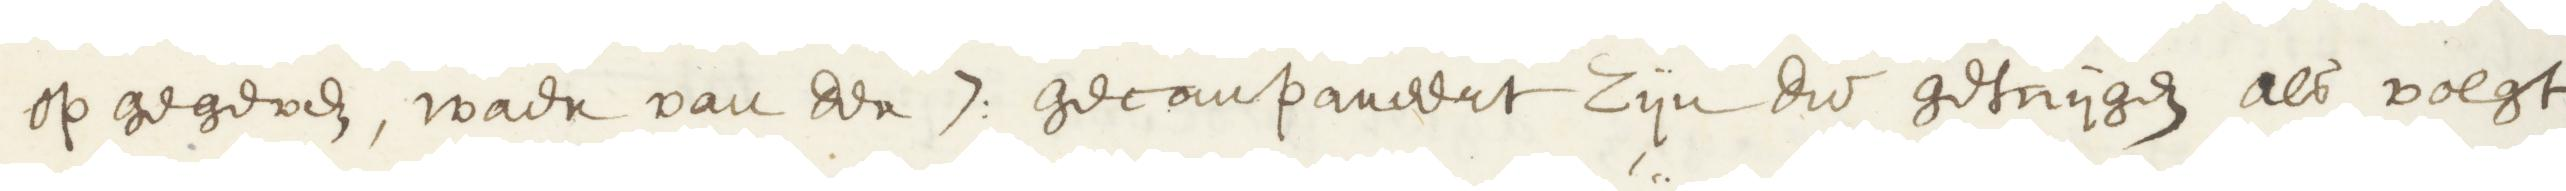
op gegeven, waer van der 7: gecompareert zijn die getuijgen als volgt
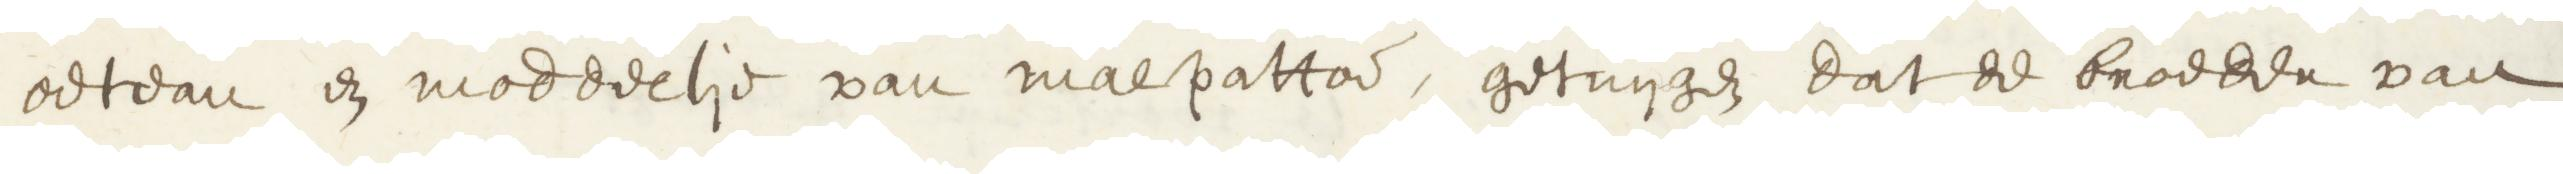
oetean en moddelje van malpattoe, getuijgen dat de broeder van
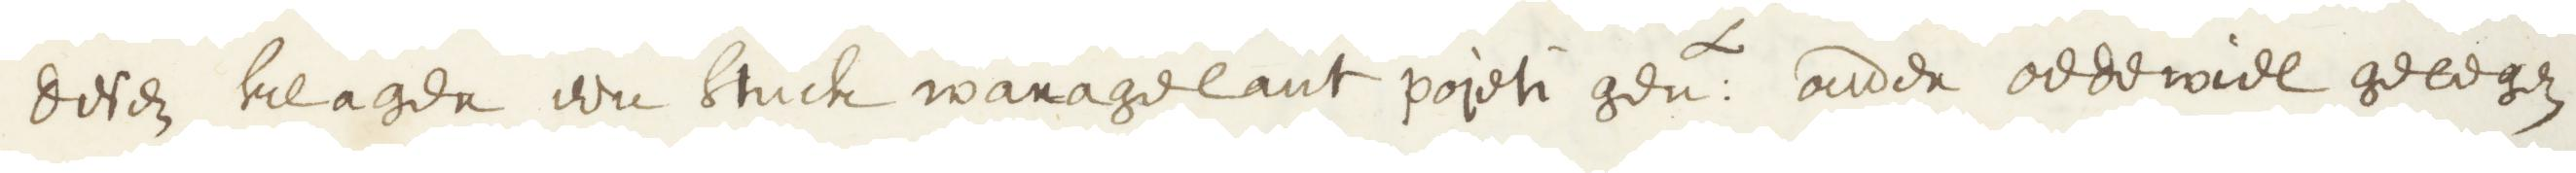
desen klager een stuck waragelant pojeli gen: onder oedewiel gelegen
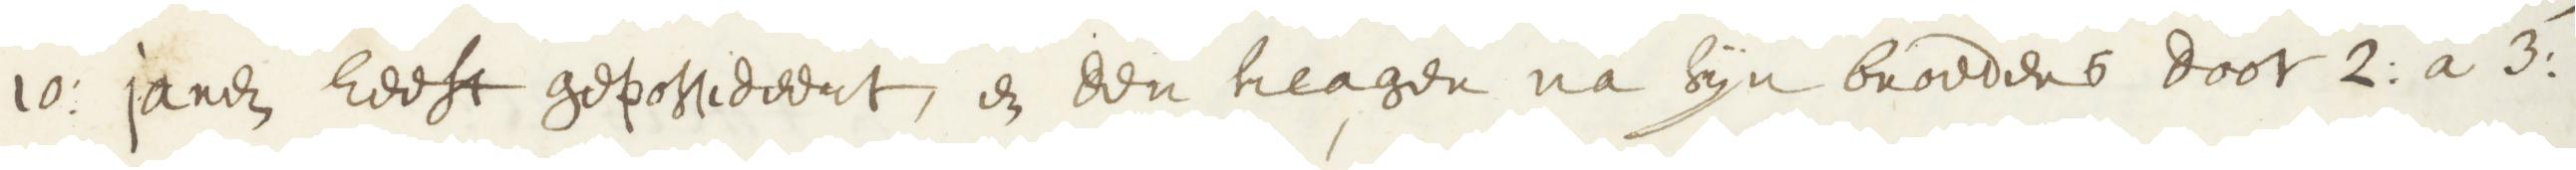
10: jaren heeft gepossideert, en den klager na sijn broeders door 2: â 3:
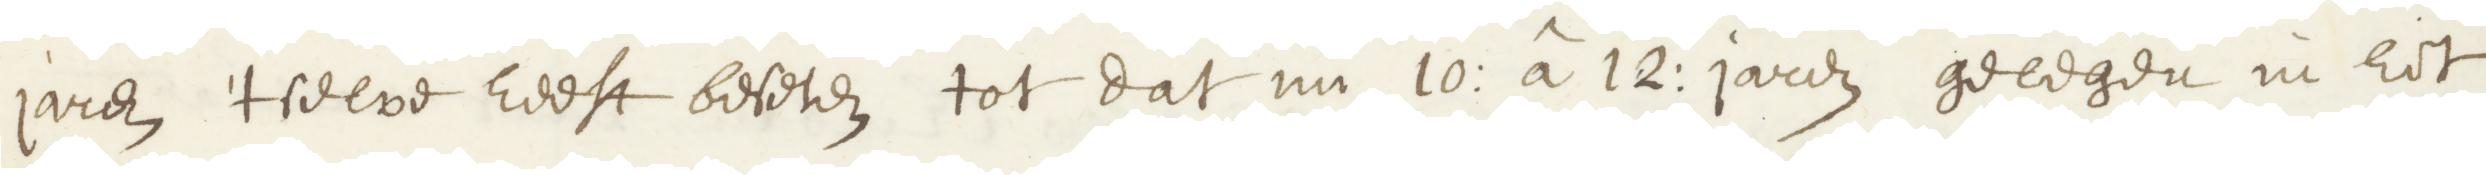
jare 'tselve heeft beseten tot dat nu 10: â 12: jaren gelegen in het
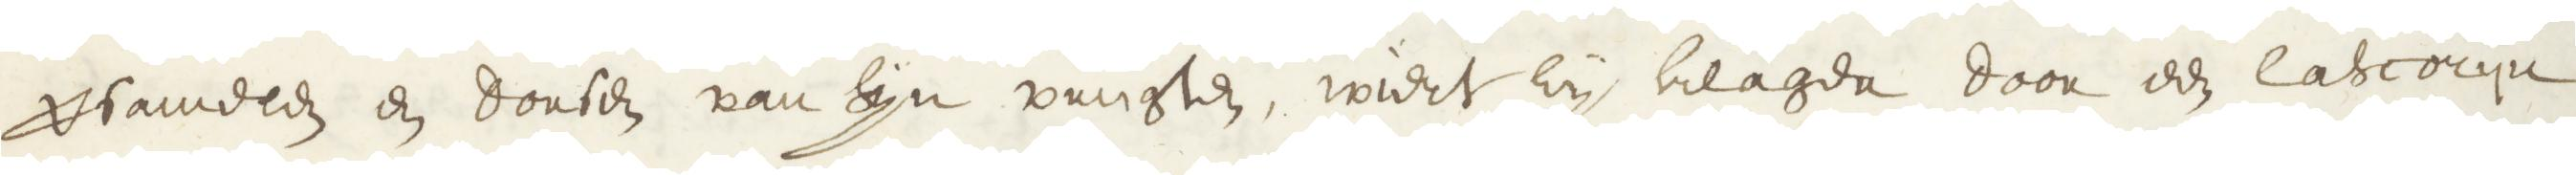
versamelen en dorsen van sijn vrugten, wiert hij klager door een lascorijn
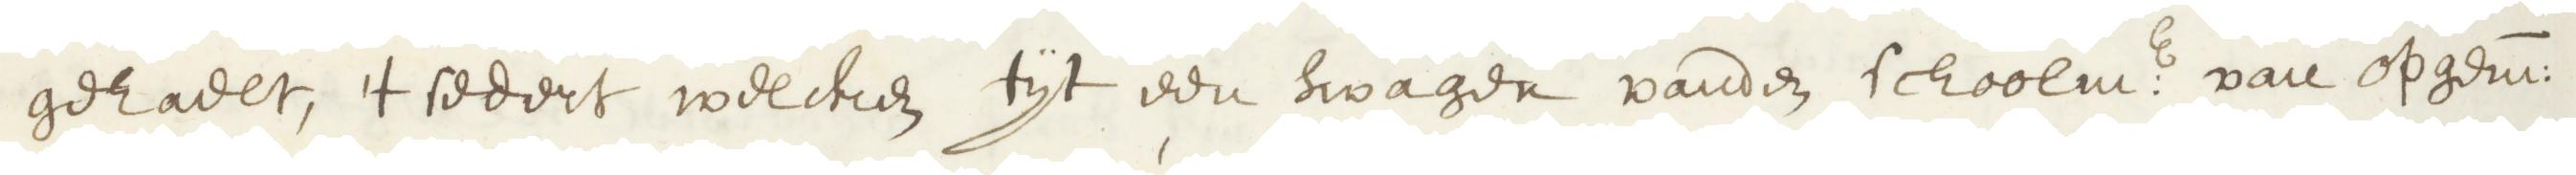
gehaelt, ’t sedert welcken tijt een swager vanden schoolm:' van opgem:
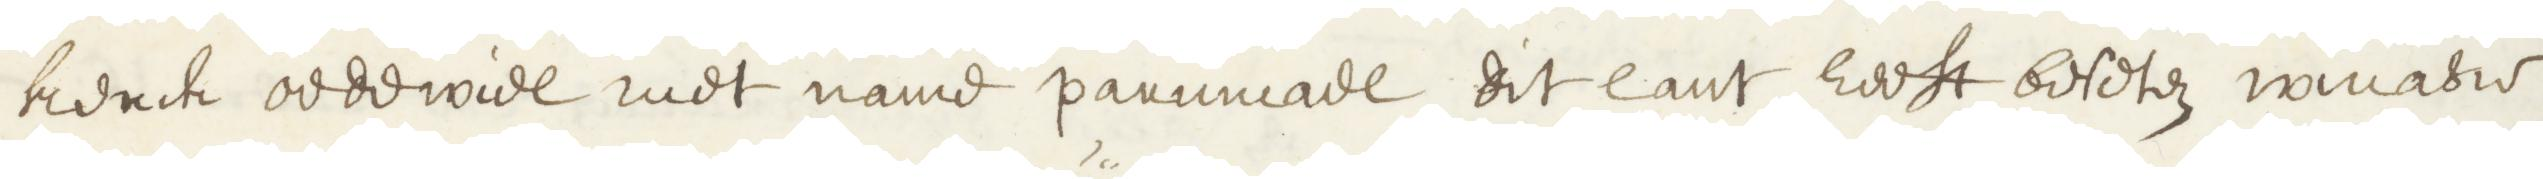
kerck oedewiel met name parumael dit lant heeft beseten winasie
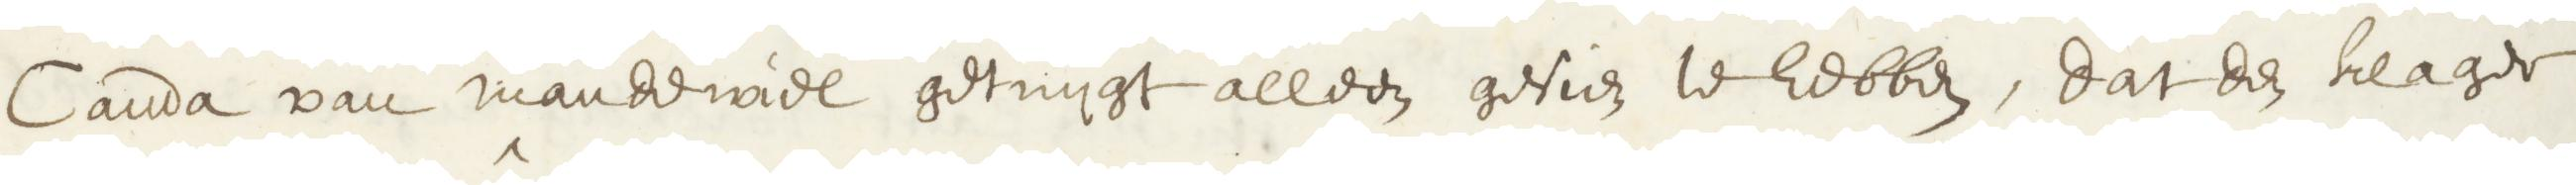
Canda van mandewiel getuijgt alleen gesien te hebben, dat den klager
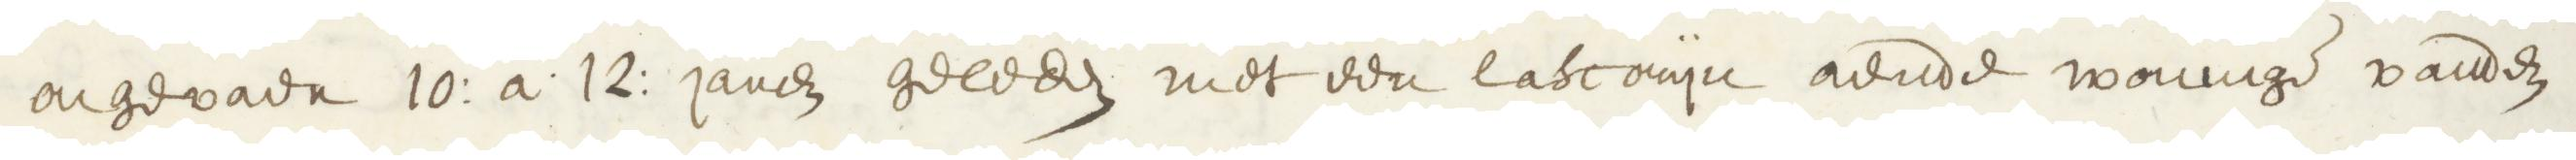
ongevaer 10: â 12: jaren geleden met een lascorijn aende woninge vanden
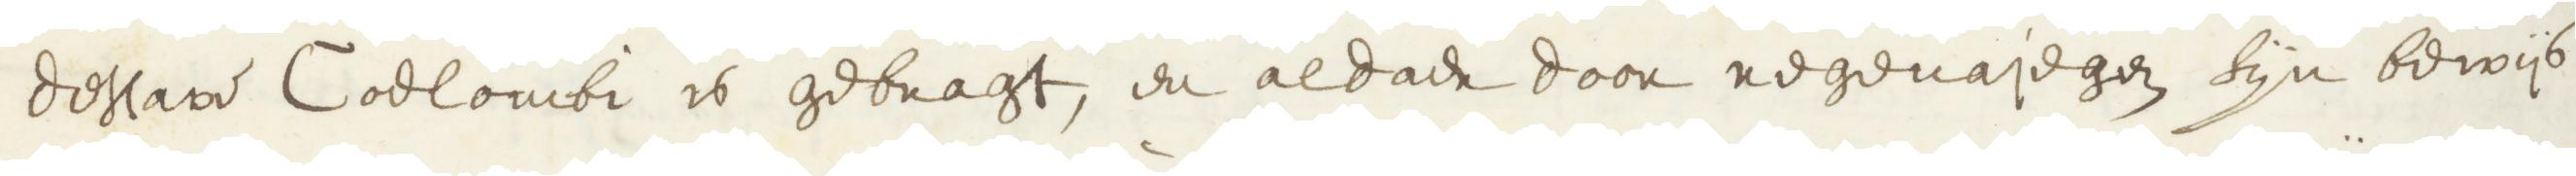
dessave Coelombi is gebragt, en aldaer door regenajegen sijn bewijs
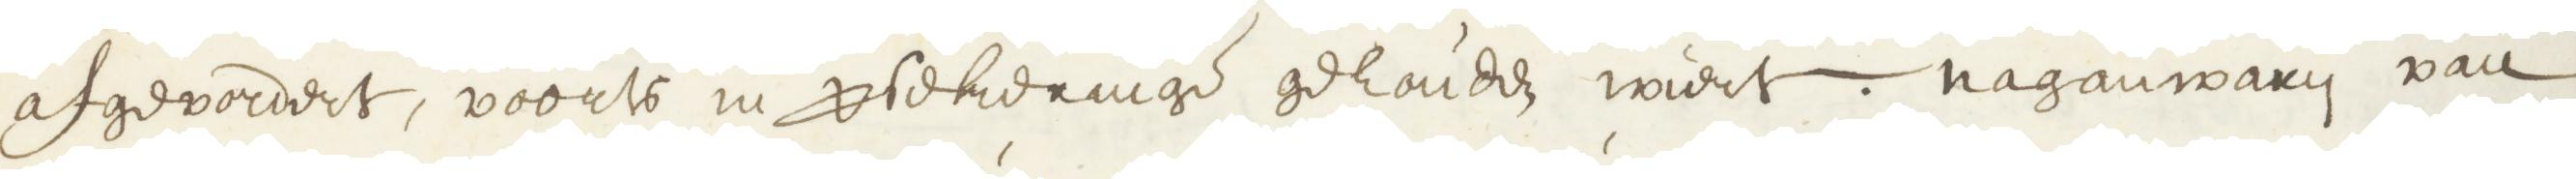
afgevordert, voorts in versekeringe gehouden wiert. naganwarij van
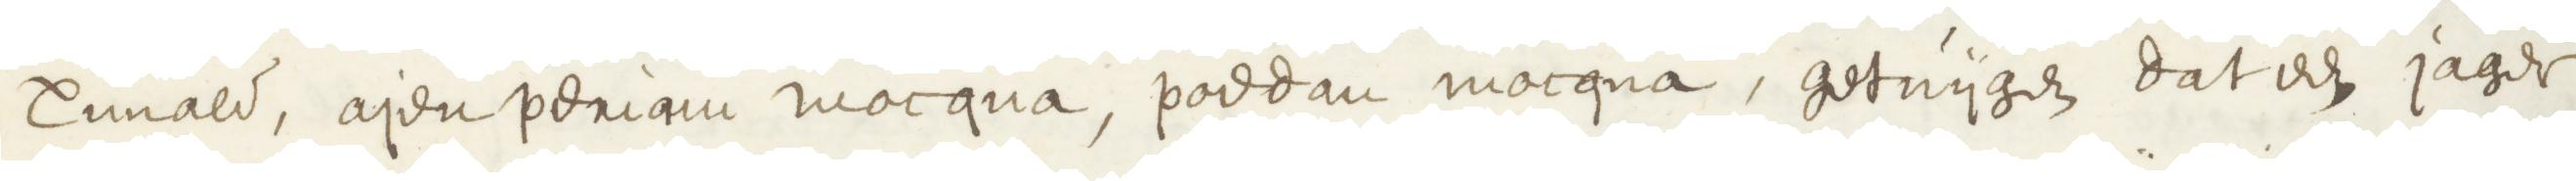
Tunale, ajen periqm mocqua, poedan mocqua, getuijgen dat een jager
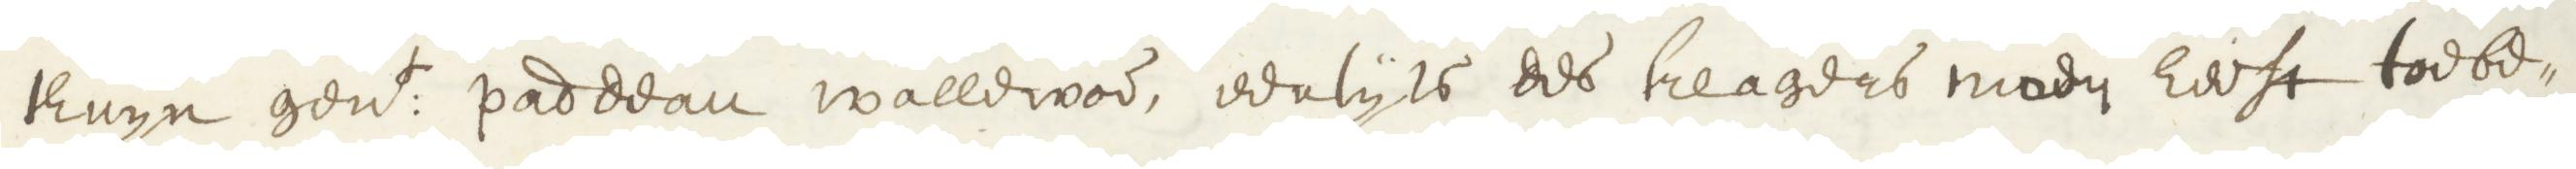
thuijn gen:t paddean wallewoe, eertijts des klagers moeij heeft toebe„
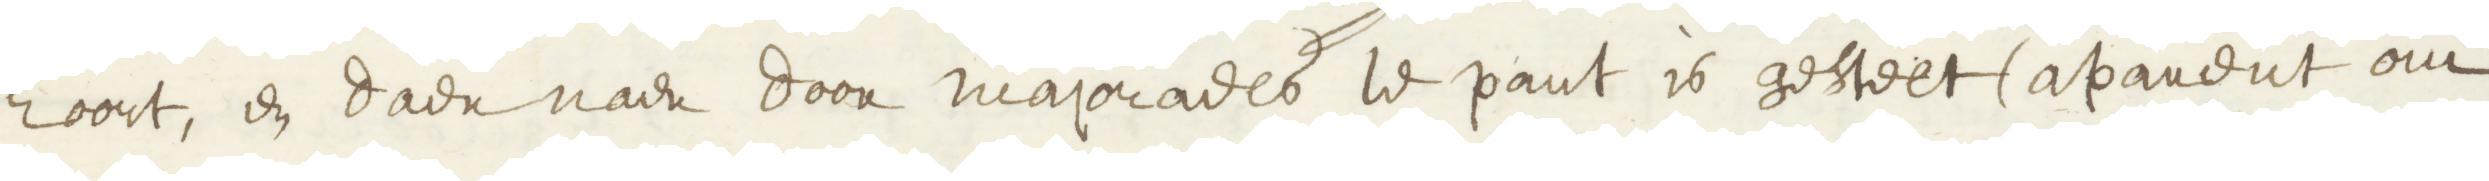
hoort, en daer naer door majoraels te pant is gestelt (aparent om
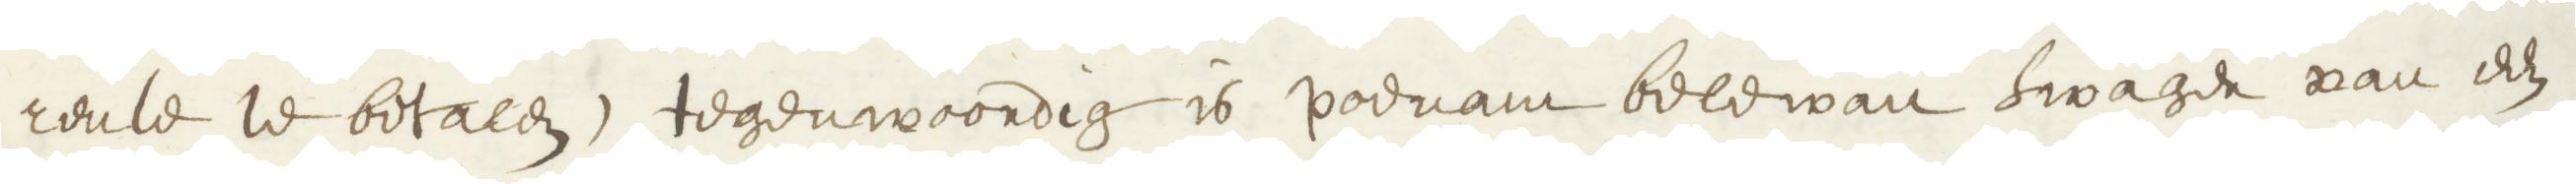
rente te betalen) tegenwoordig is poenam belewan swager van een
